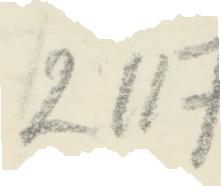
2117
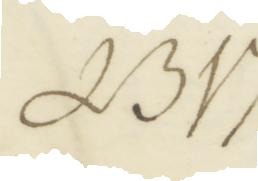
2317
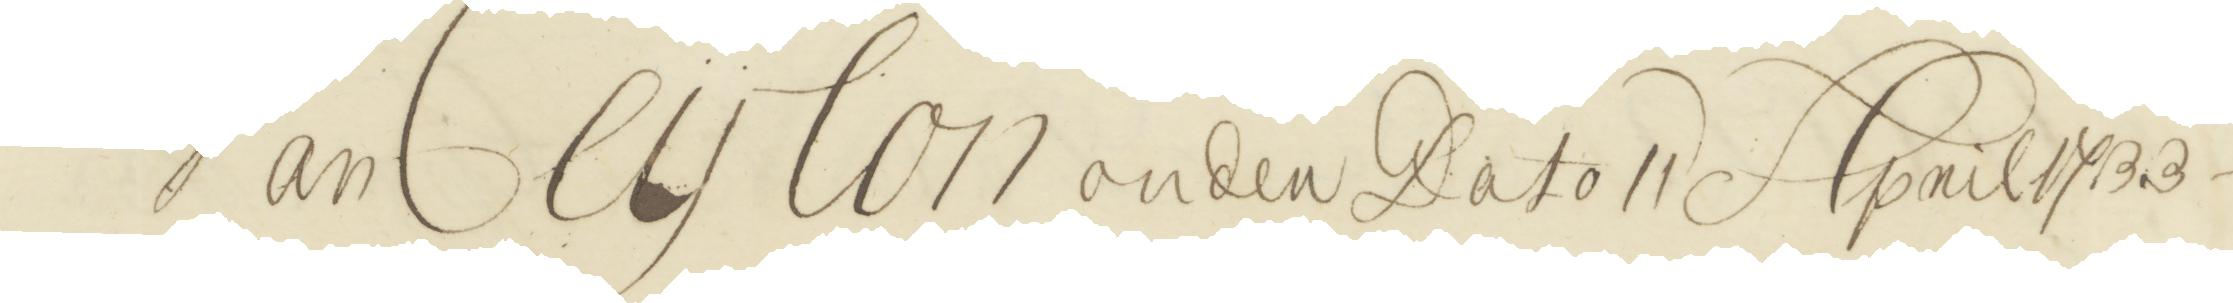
Van Ceijlon onder Dato 11:' April 1733.
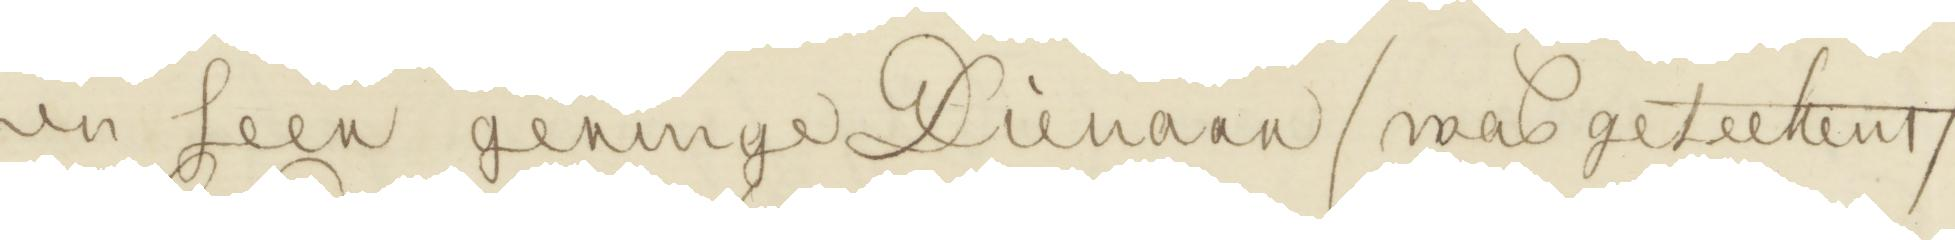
en seer geringe Dienaar /was geteekent/
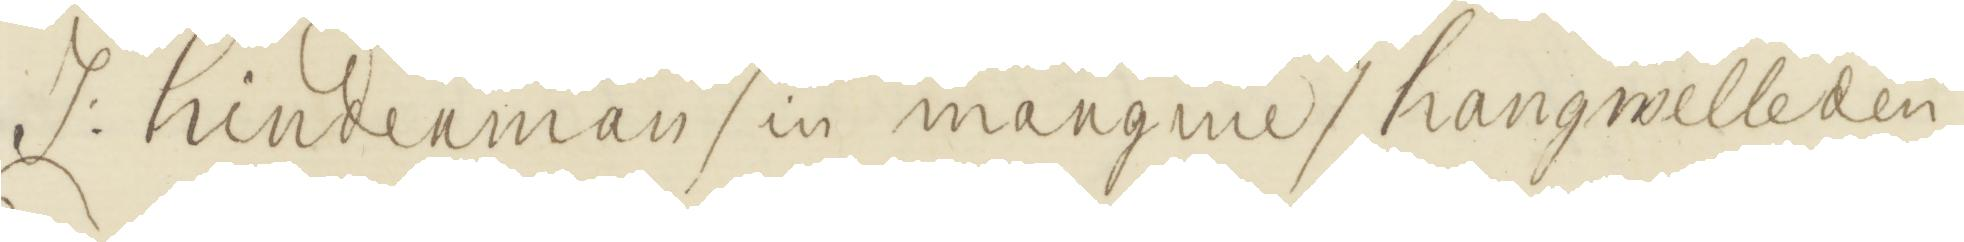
I: hinderman /in margine / hangwelle den
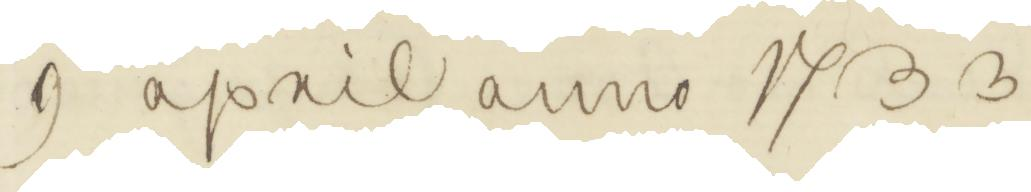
9 april anno 1733
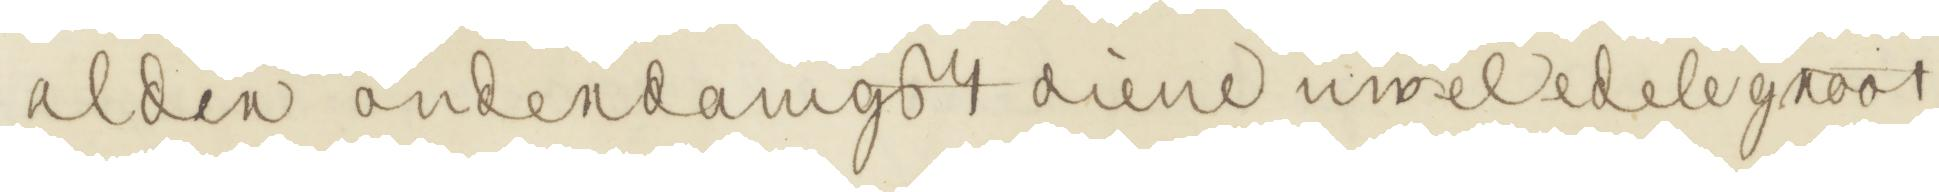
alder onderdanigst diene uwel edele groot
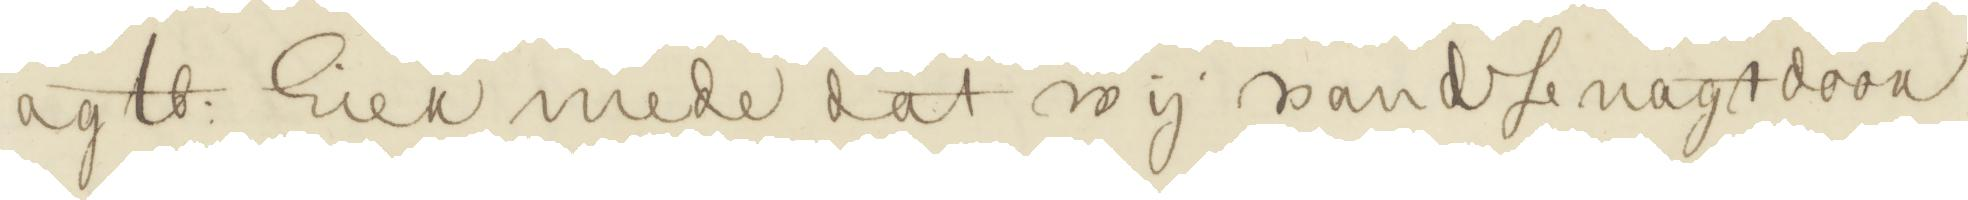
agtb: hier mede dat wij van dese nagt door
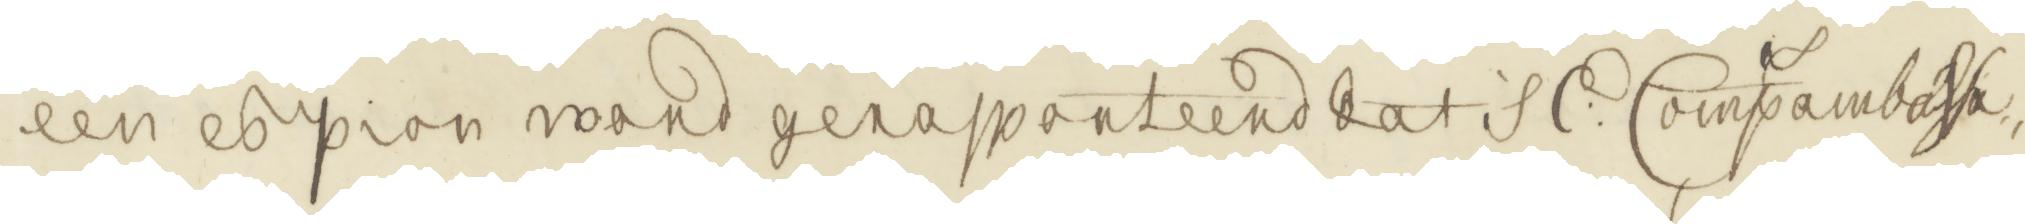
een espion word gerapporteerd dat 's E: Comp:s ambassa,
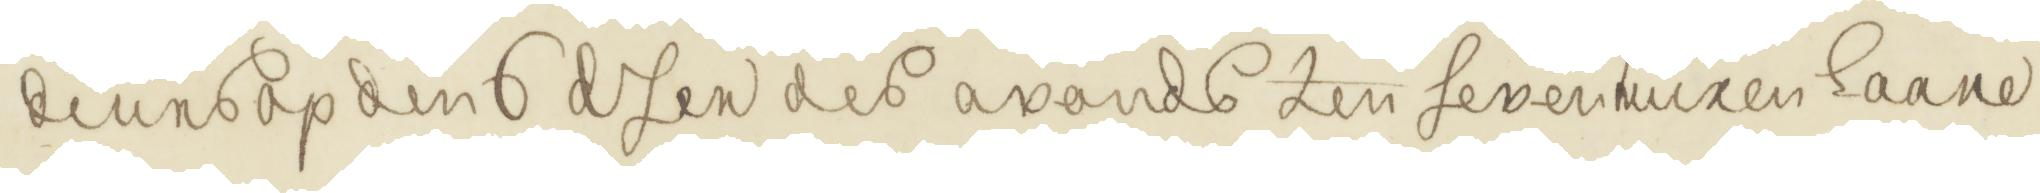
deurs op den 6 deser des avonds ten seven uuren haare
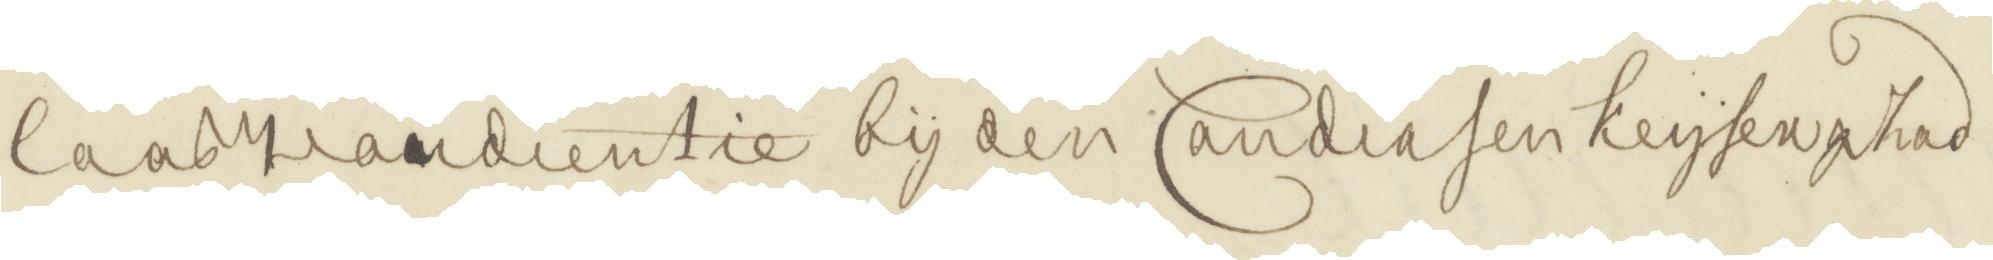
laaste audientie bij den Candiasen keijser gehad
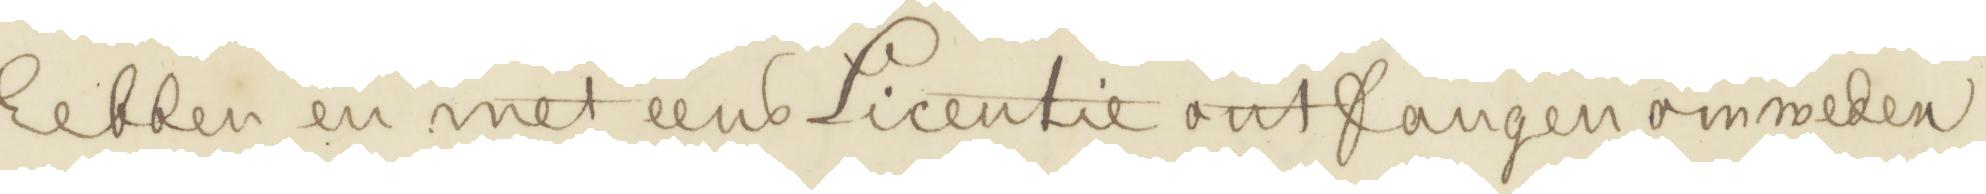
hebben en met eens Licentie ontfangen om weder
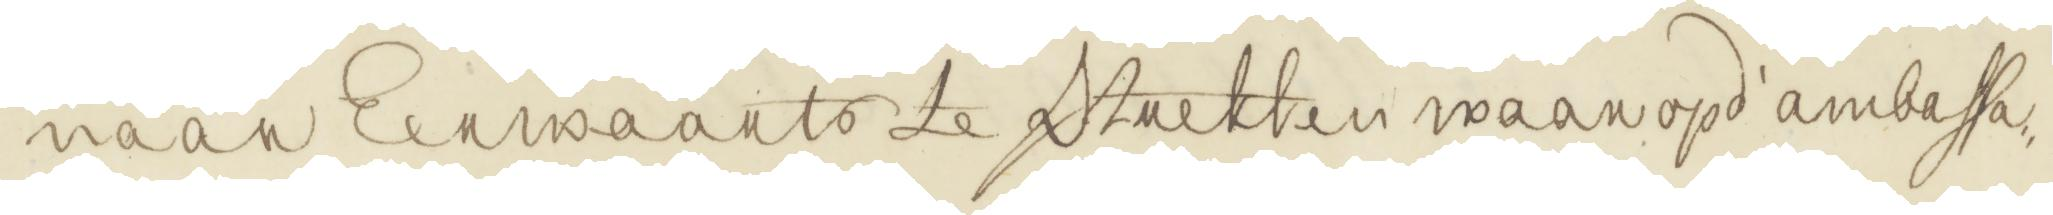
naar herwaarts te vertrekken waar op d’ ambassa„
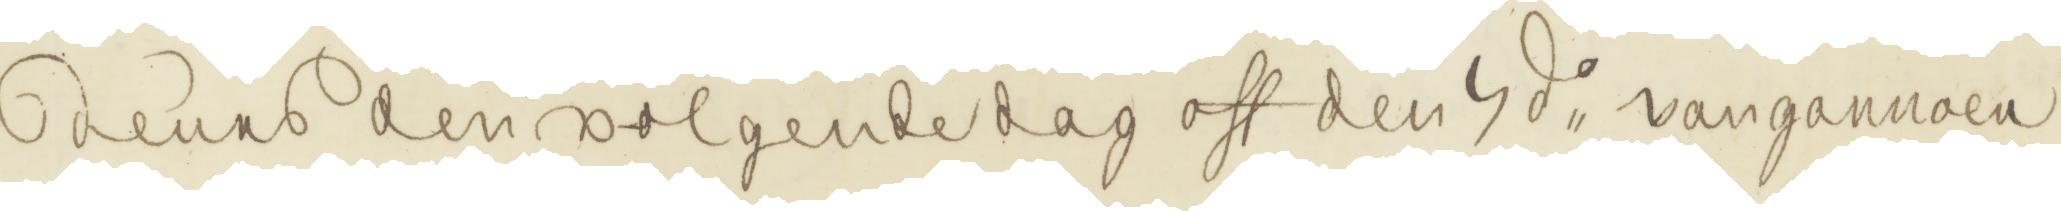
deurs den volgende dag off den 7 d„o van gannoer
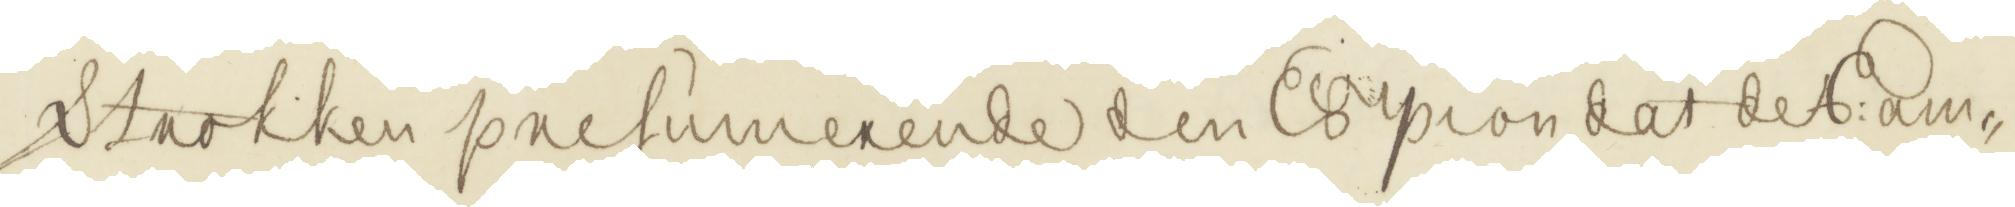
vertrokken presumerende den Espion dat de E: am„
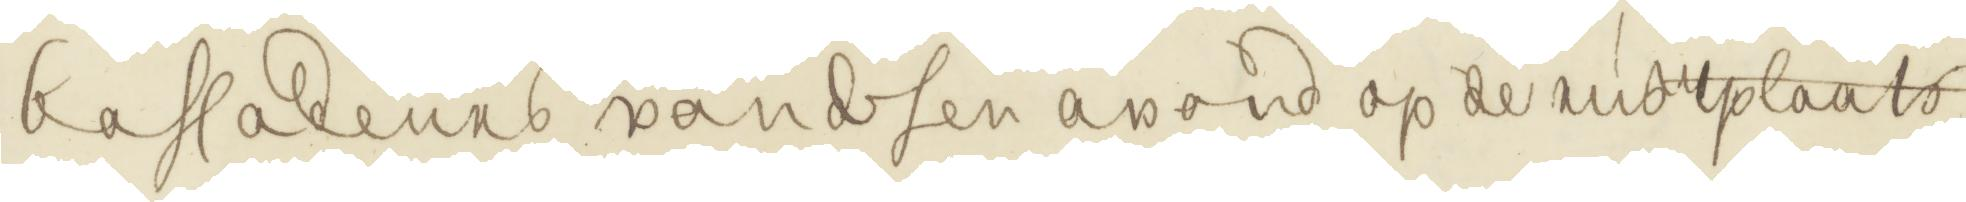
bassadeurs van desen avond op de rustplaats
